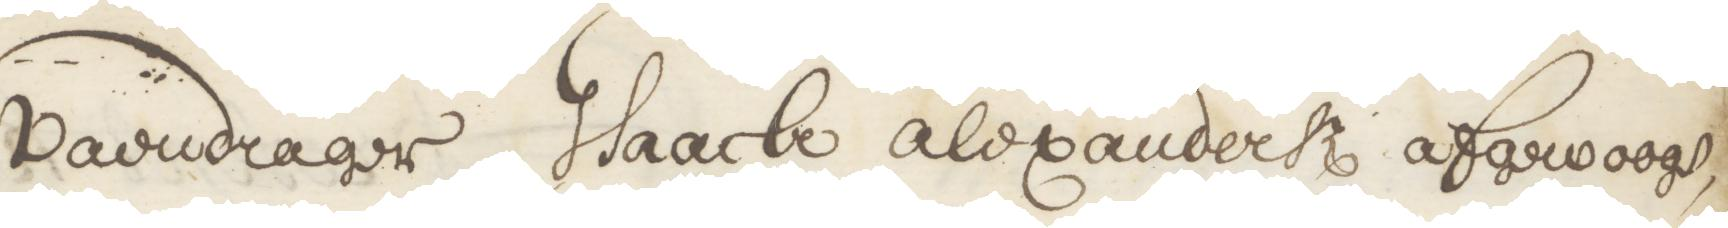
Vaendrager Isaack Alexandersz afgewooge,
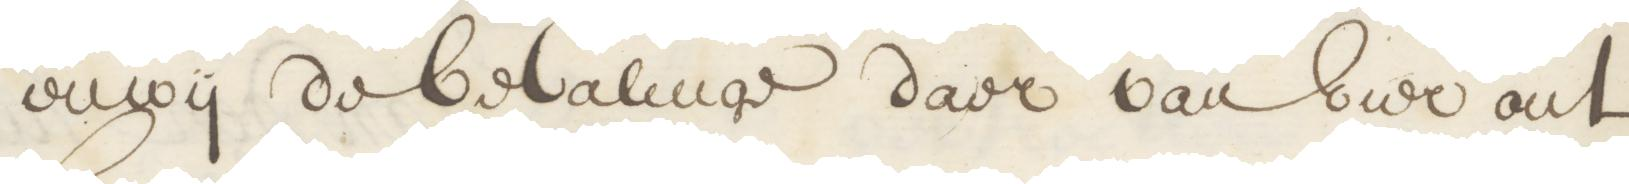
en wij de betalinge daer van hier ont
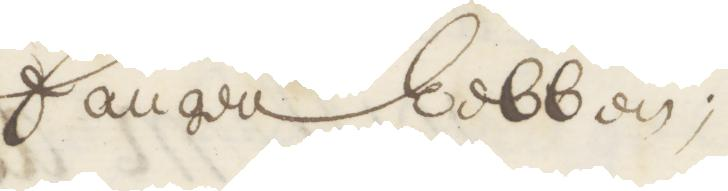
fangen hebben;
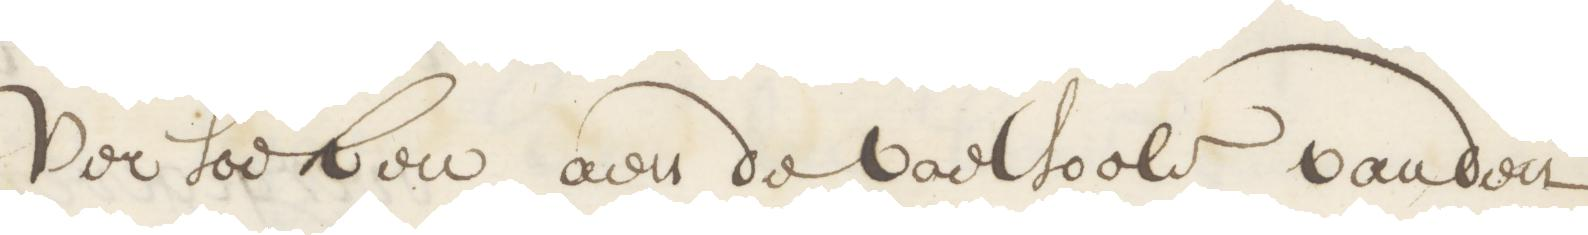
Versoeken aen de voetsoole van den
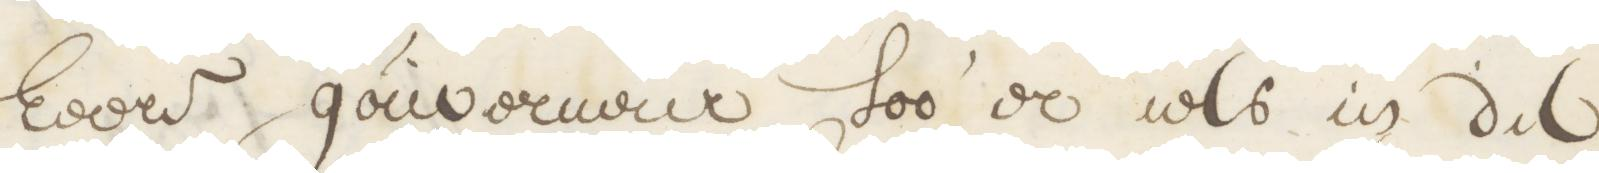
heere gouverneur soo ’er iets in dit
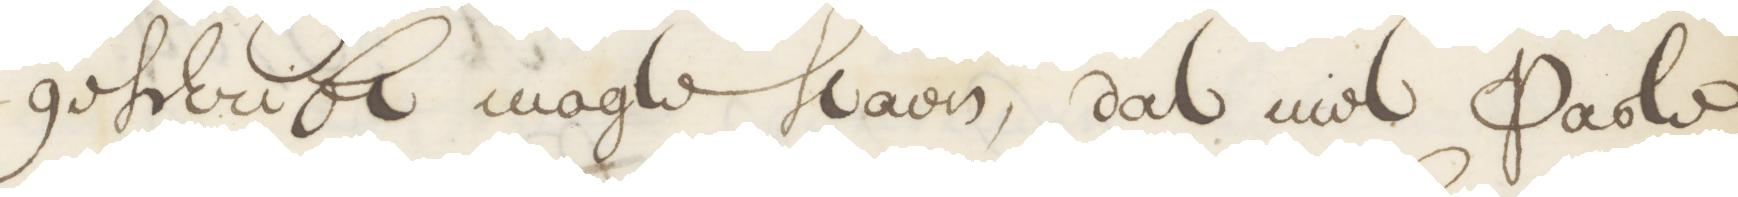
geschrift mogte staen, dat niet Paste
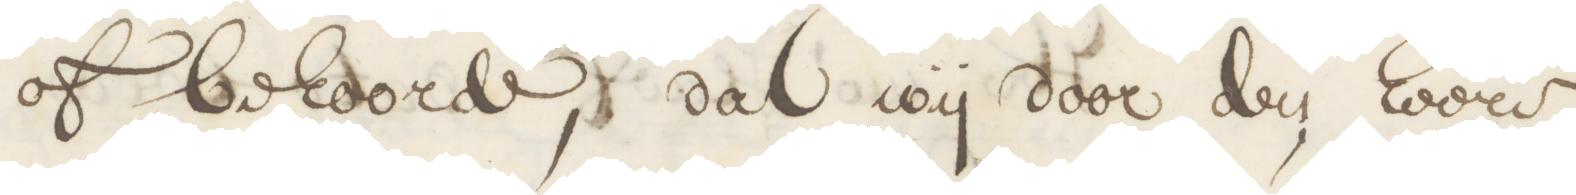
of behoorde, dat wij door den heere
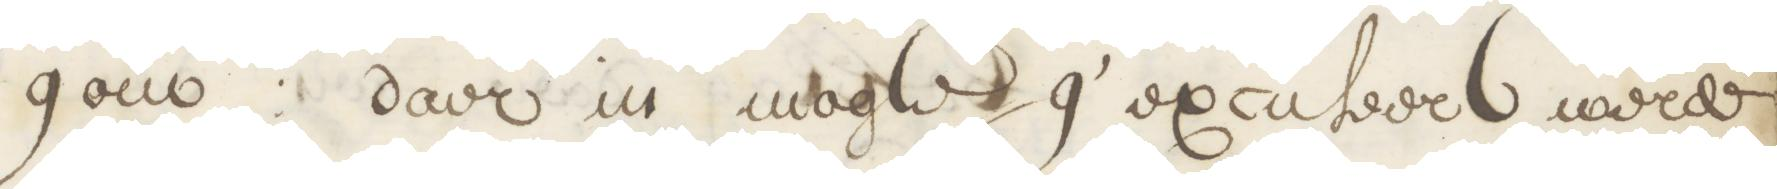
gouv: daer in mogte g’excuseert werde,
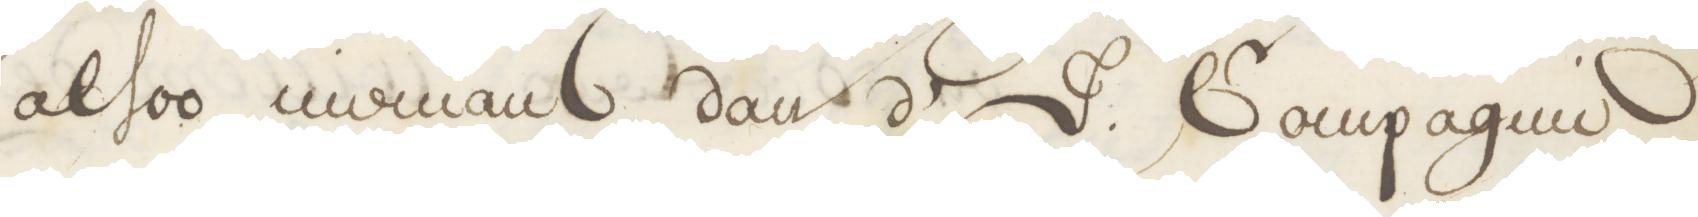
alsoo niemant, dan d' E. Compagnie,
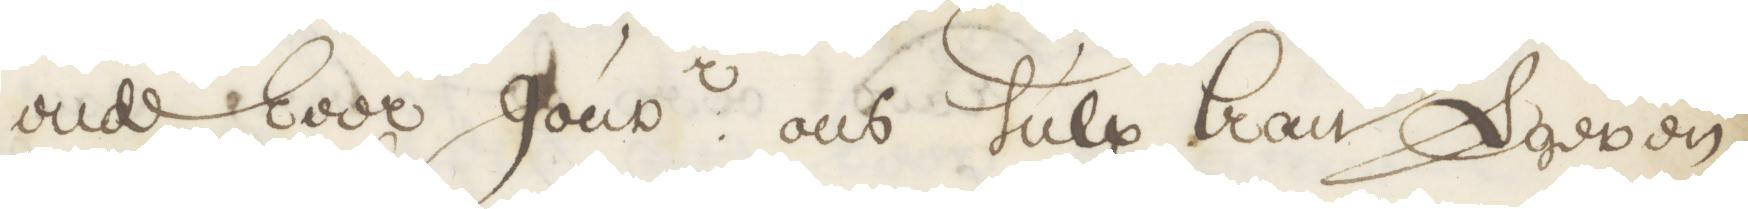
ende heer gouv:r ons sulx kan vergeven
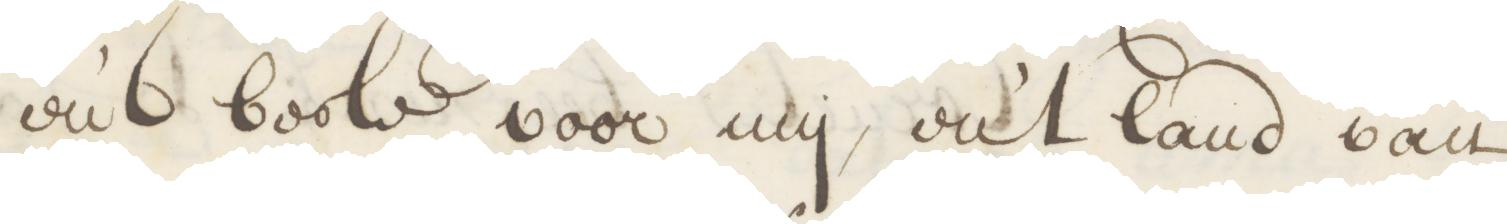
en't beste voor mij, en’t land van
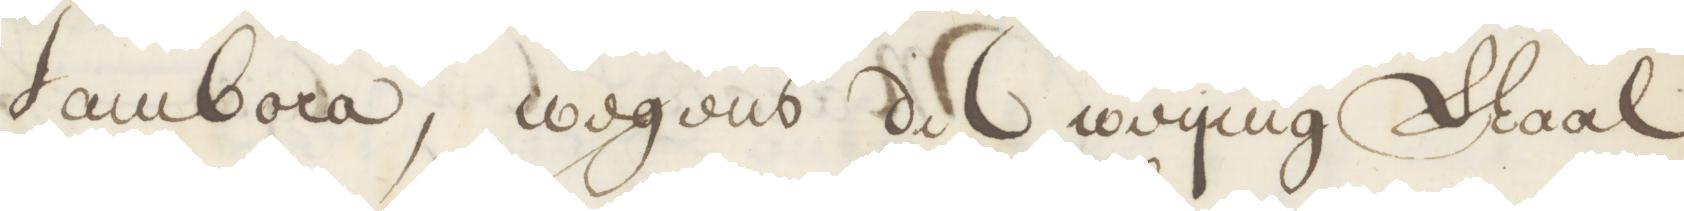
tambora, wegens dit weijnig verhaal
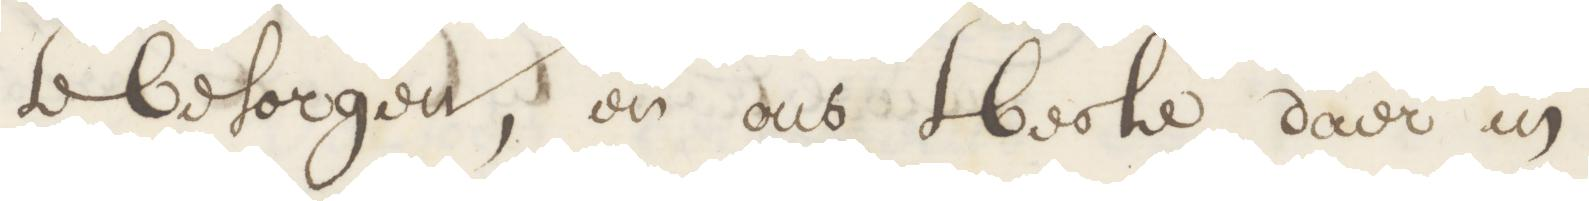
te besorgen, en ons tbeste daer in
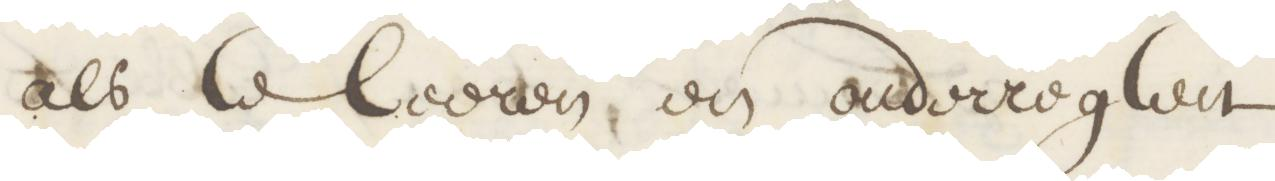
als te leeren en onderregten
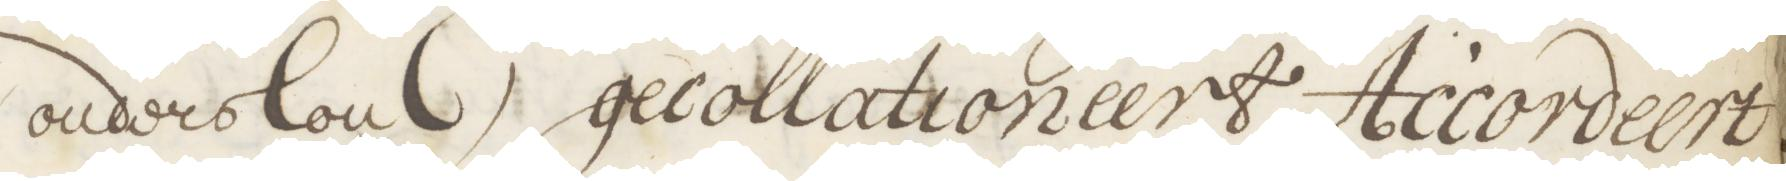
onderstont, gecollationeert Accordeert
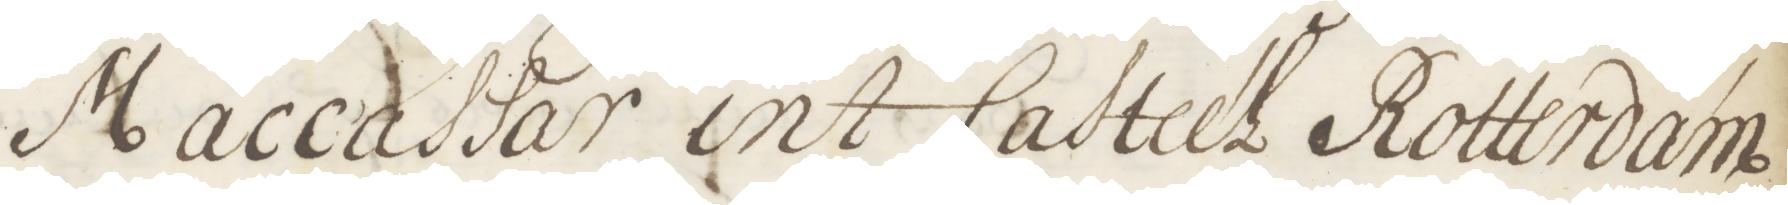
Maccassar in ’t Casteel Rotterdam
